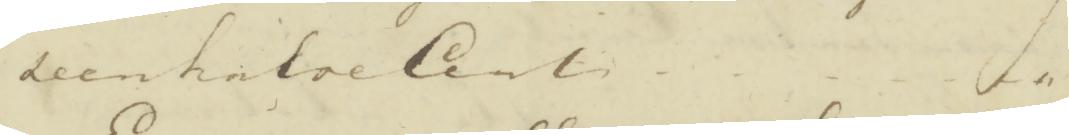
& een halve Cents - - - - - „
